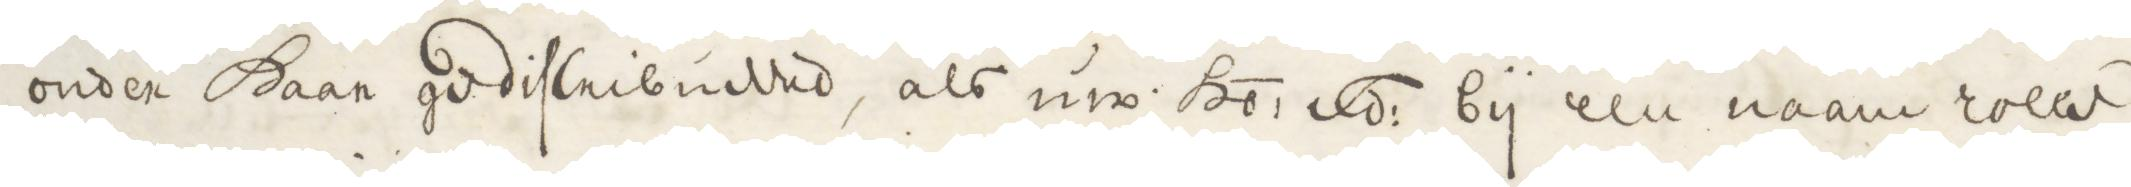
onder haar gedistribueerd, als uw. ho: Ed: bij een naam rolle
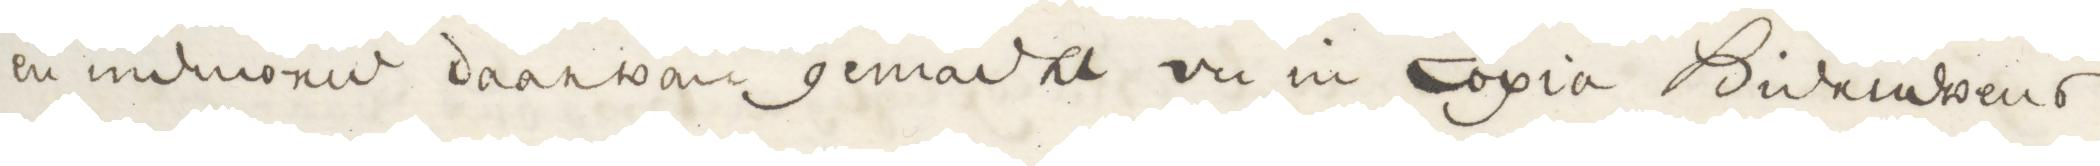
en memorie daarvan gemaekt en in Copia hiernevens
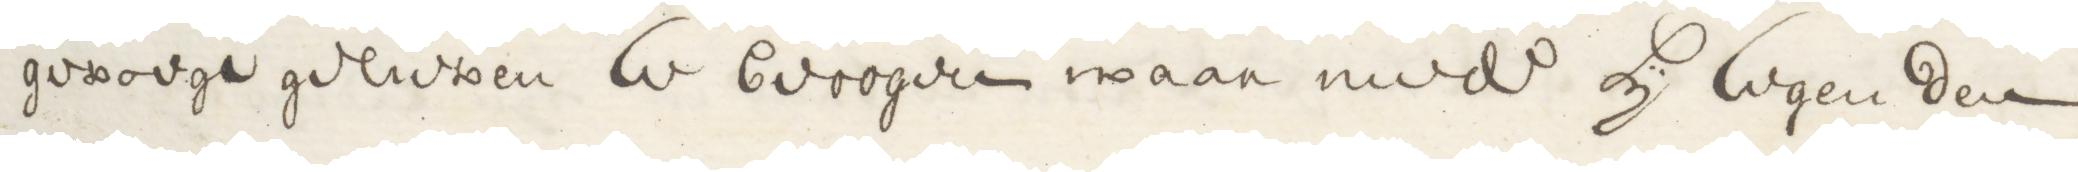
gevoegt gelieven te beoogen waar mede sij tegen den
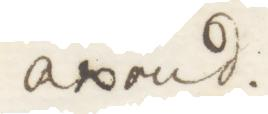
avond.
